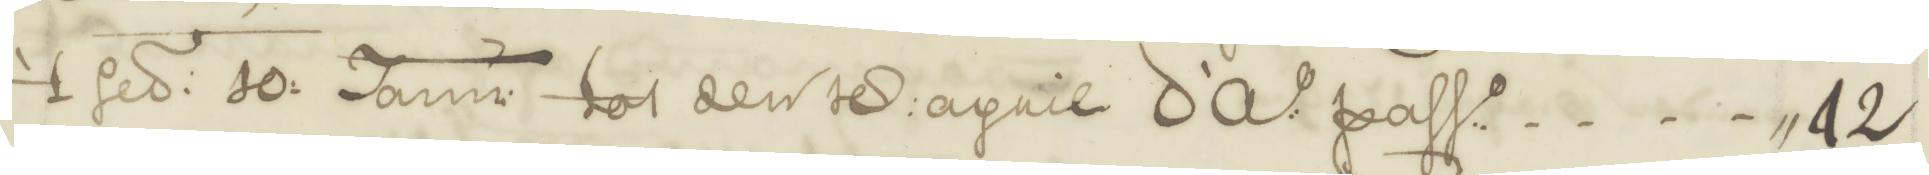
't sed:t 10: Janu: tot den 18: april d’A:o pass:o . . . . „ 42
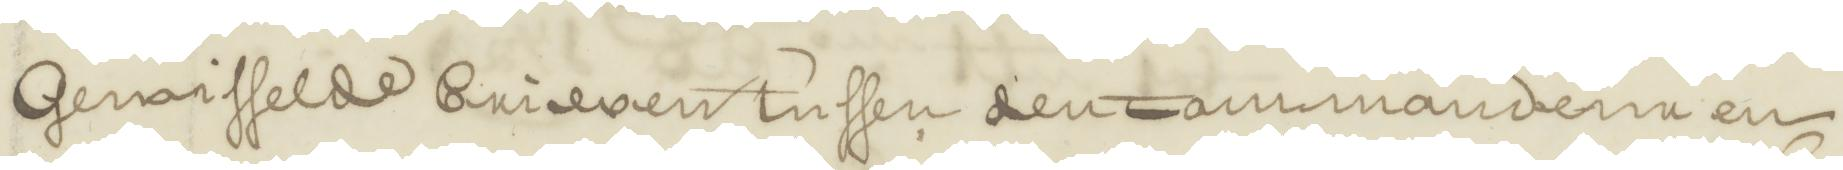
Gewisselde brieven tussen den commandeur en
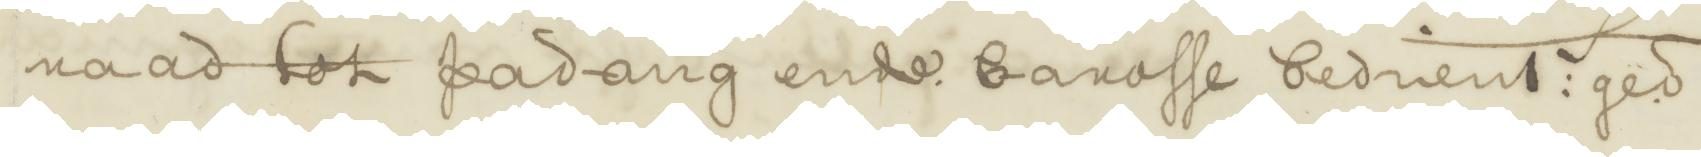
raad tot padang ende barosse bedient:s ged
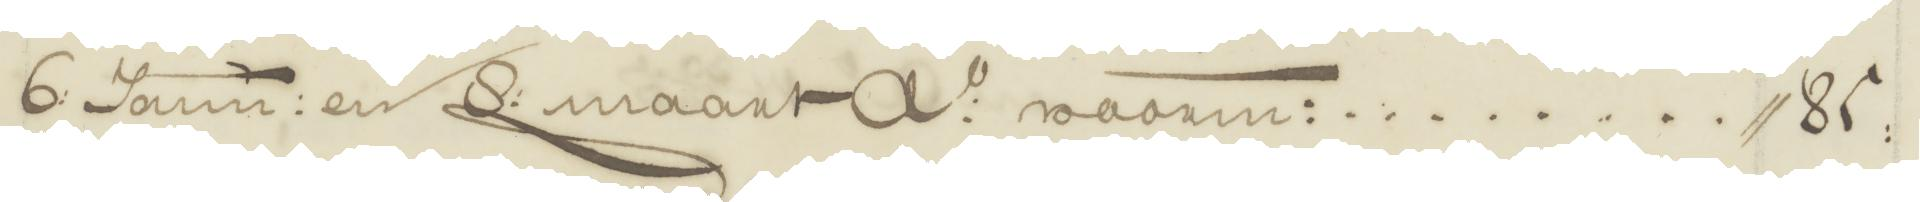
6: Janu: en 8: maart A:o voorm: . . . . . . . . „85:
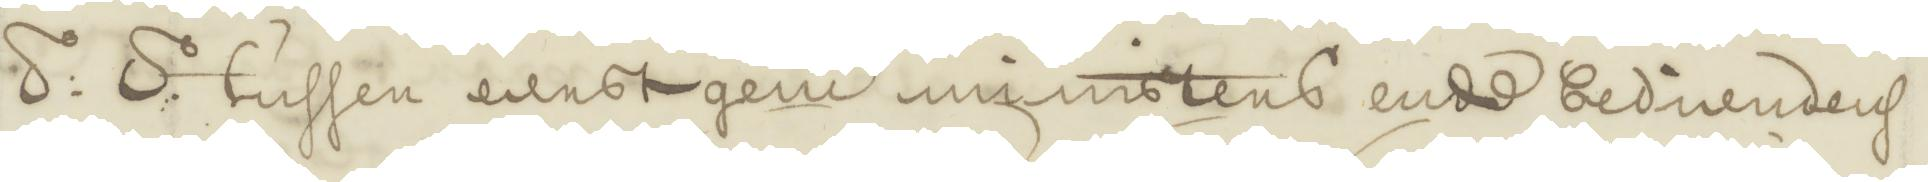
d:o d:o tussen eerst gem ministers ende bediendens
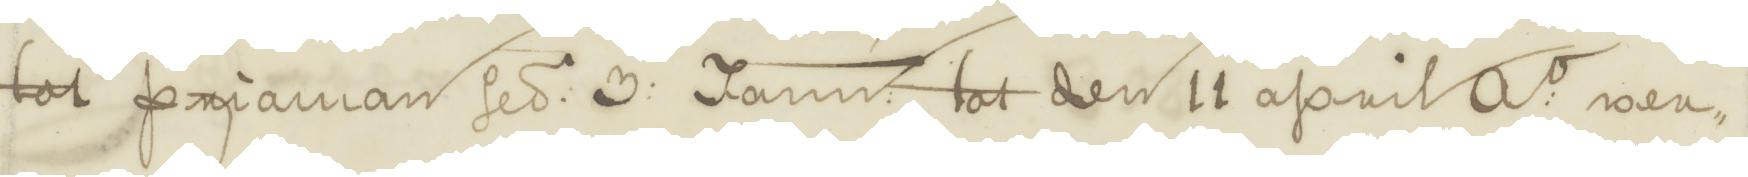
tot priaman sed: 3: Janu: tot den 11 april A:o ver„
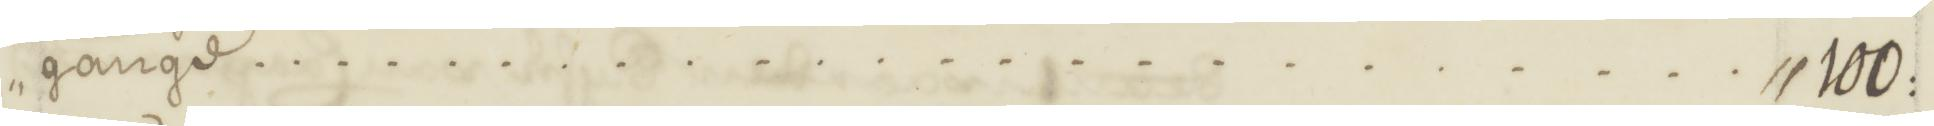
„gange . . . . . . . . . . . . . . . . . . . . . . . . „ 100:
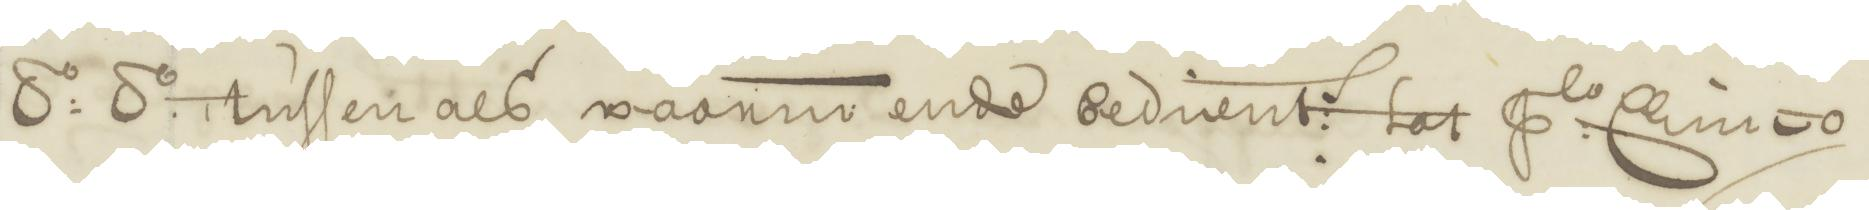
d:o d:o tussen als voorm: ende bedient:s tot p:lo Chinco
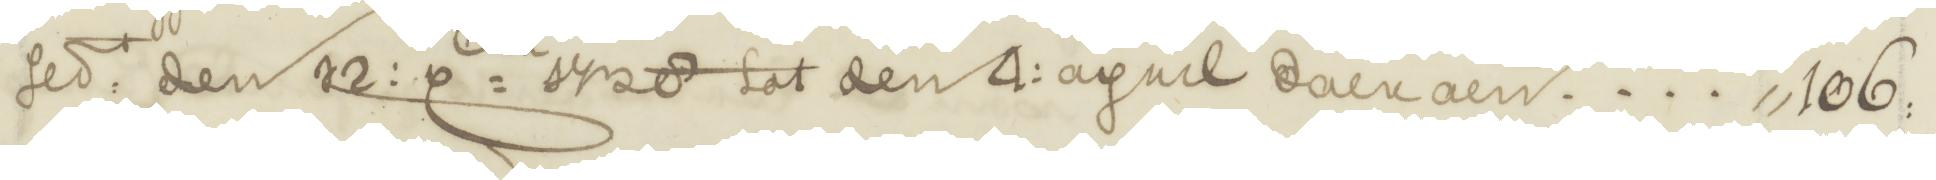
sed:t den 12: x= 1728 tot den 4: april daer aen . . . . „106:
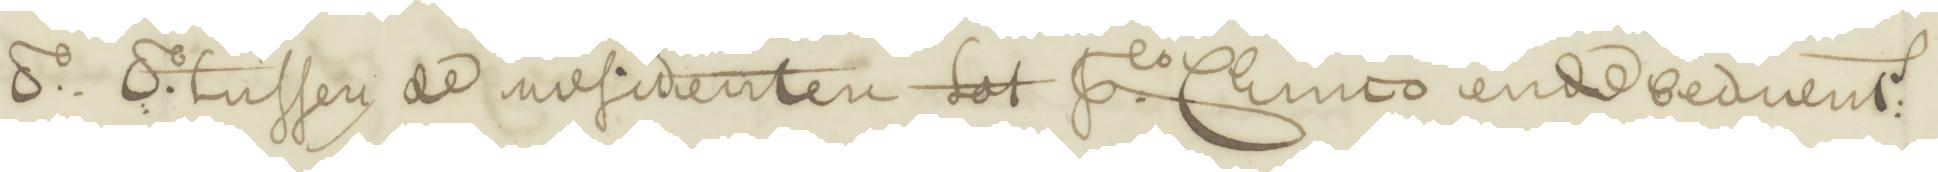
d:o d:o tussen de residenten tot p:lo Chinco ende bedient:s
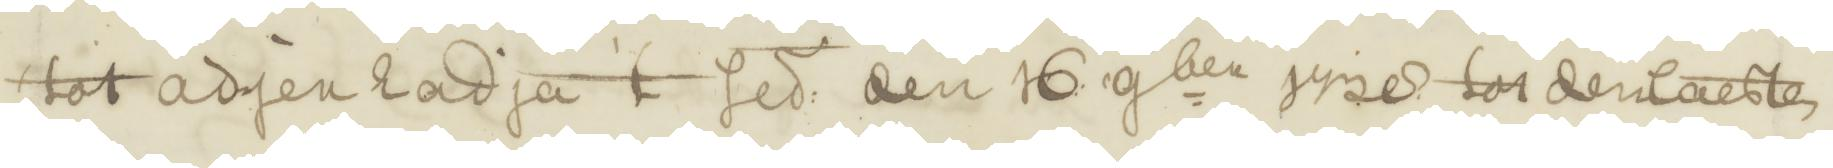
tot adjerhadja 't sed:t den 16:' 9=ber 1728. tot den laesten
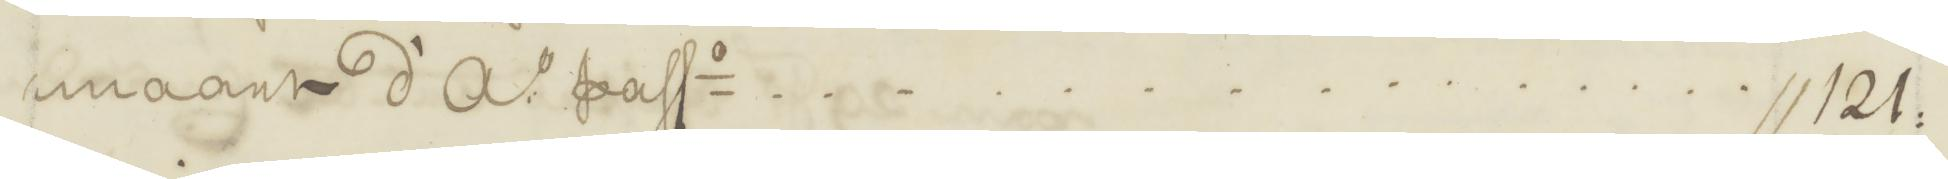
maart d’A:o pass=o . . . . . . . . . . . . . . . „ 121:
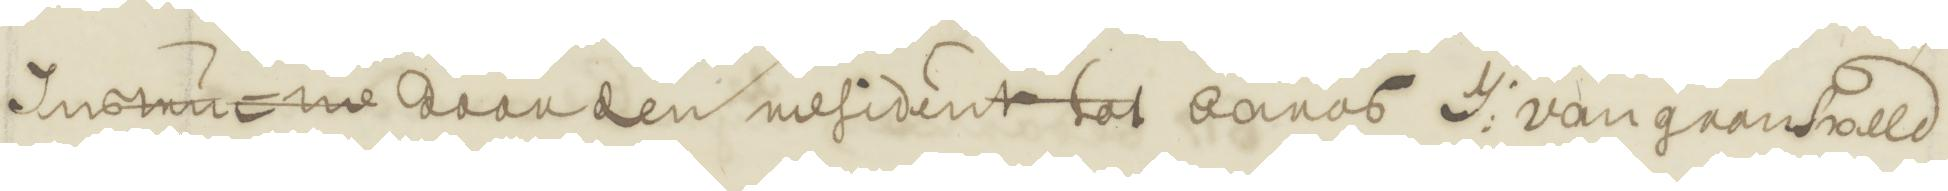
Instructie door den resident tot baros I: van gronsveld
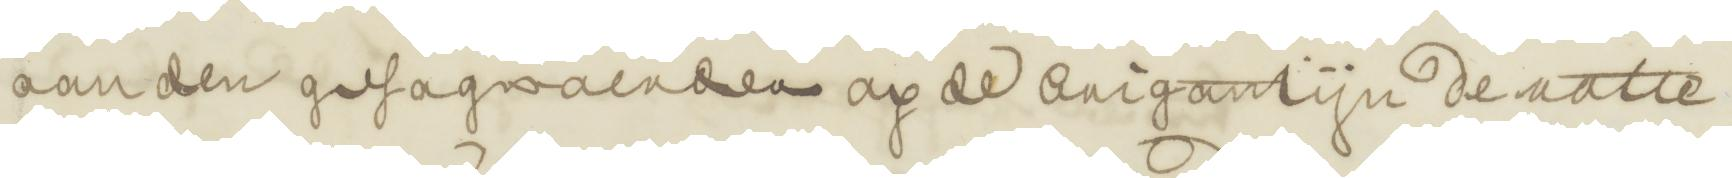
aan den gesagvoerder op de brigantijn de rotte
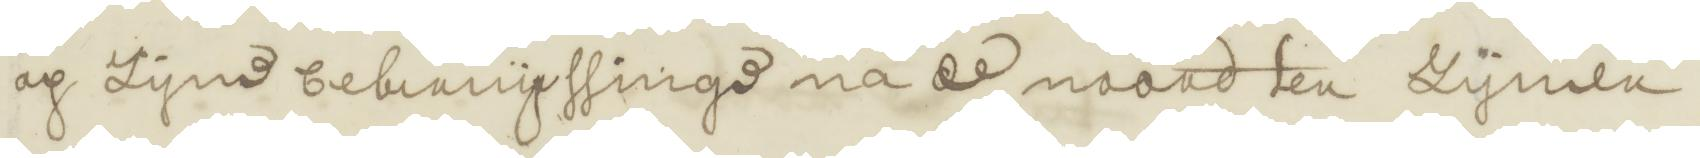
op zijne bekruijssinge na de noord ter zijnen
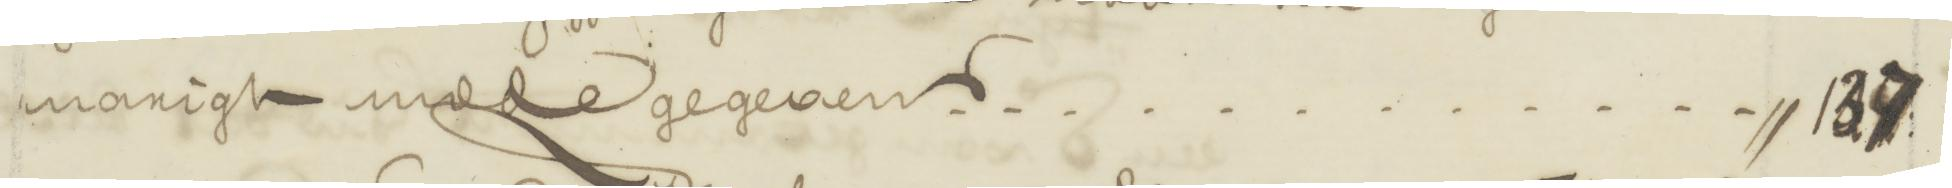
marigt mede gegeven . . . . . . . . . . . . „ 137:
